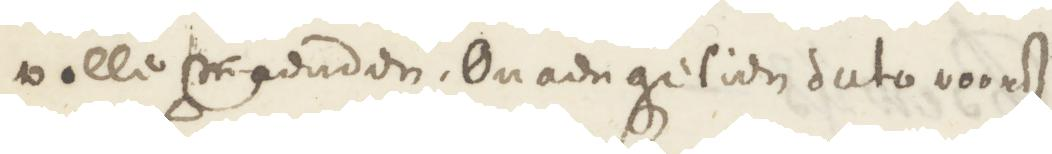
volle maenden, On aengesien dato voorꞵ
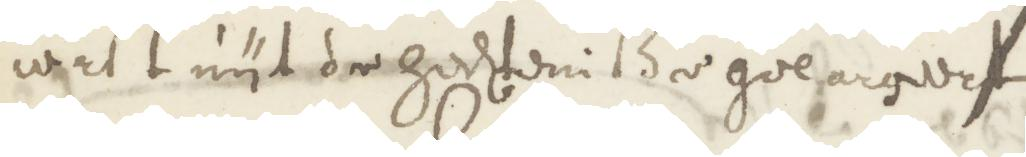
eerst uijt de hechteniꞵe gelargeert
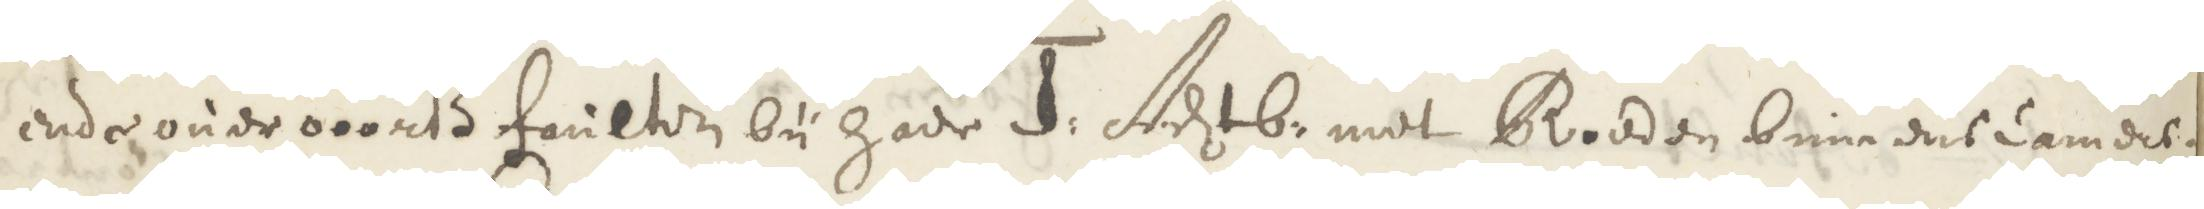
ende over voorꞵ faulten bij haer E: Achtb: met Roeden binnens Camers —
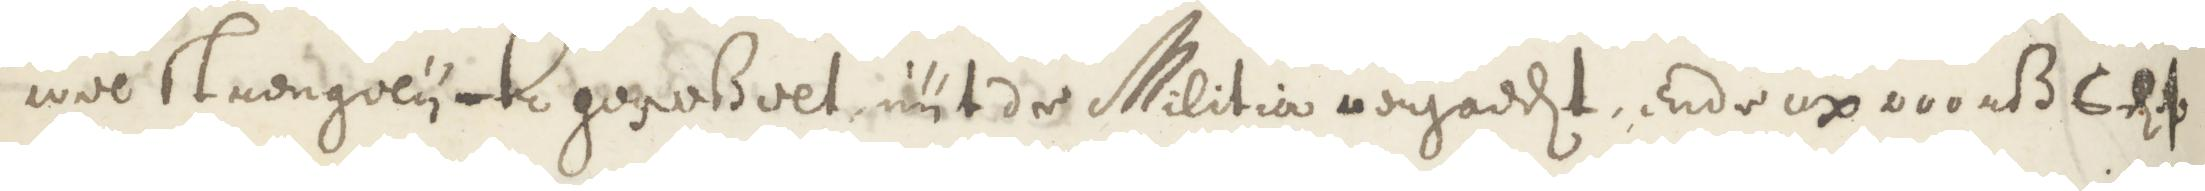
wel strengelijck gegeꞵelt, uijt de Militie verjaecht, ende op voorꞵ schip
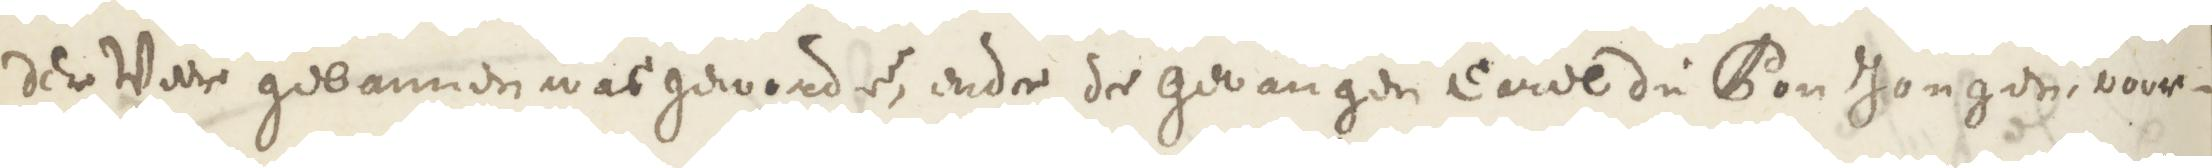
der Veer gebannen was geworde, ende de gevangen Carel du Pon Jongen, voor —
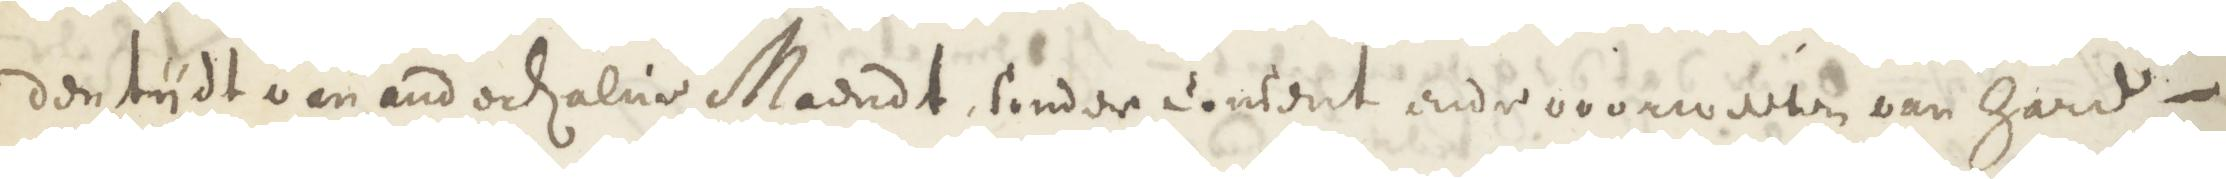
den tijdt van anderhalve Maendt, sonder consent ende voorweeten van hare —
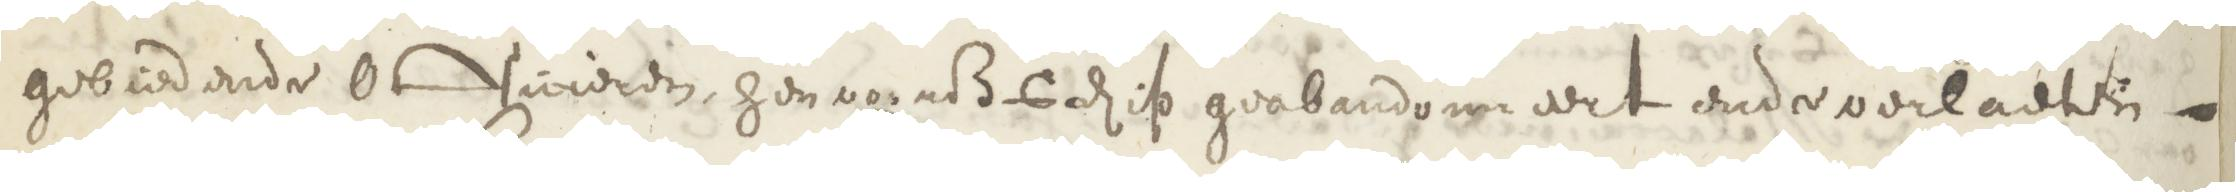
gebiedende Officieren, hen voorꞵ schip geabandonneert ende verlaeten —
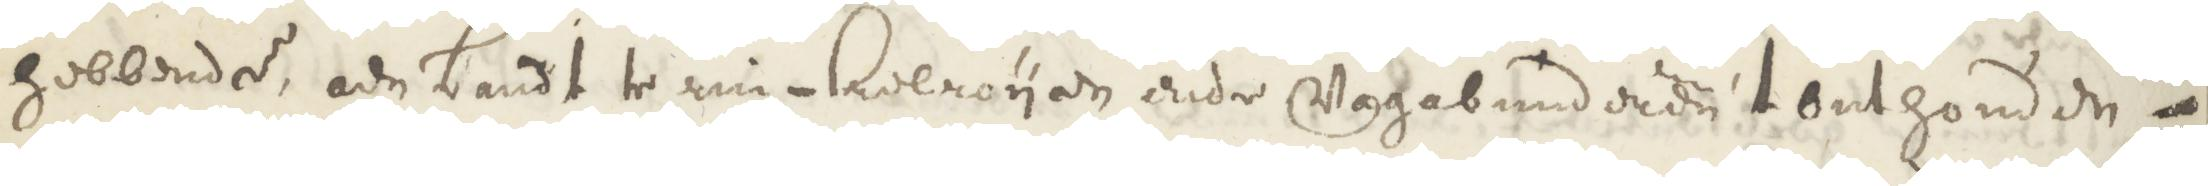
hebbende, aen Landt te rinckelroijen ende vagabunderen ’t onthouden —
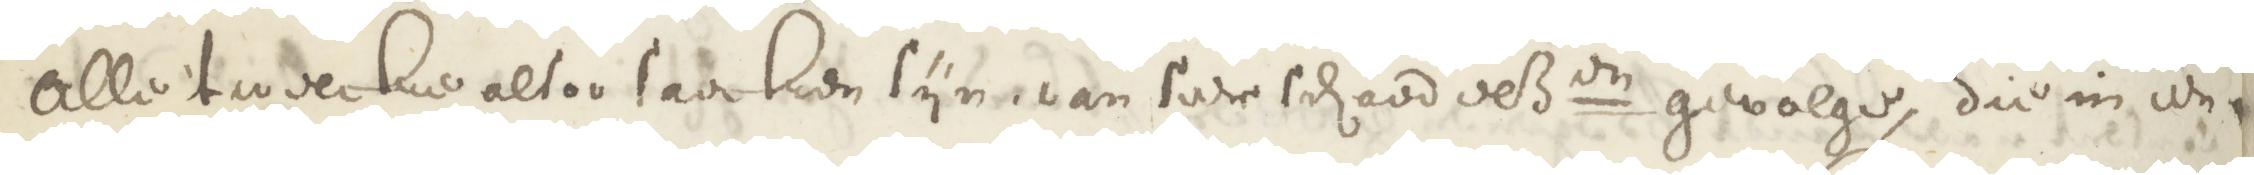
alle 't welcke alsoo saecken Sijn van seer schaedelijk=en gevolge, die in een
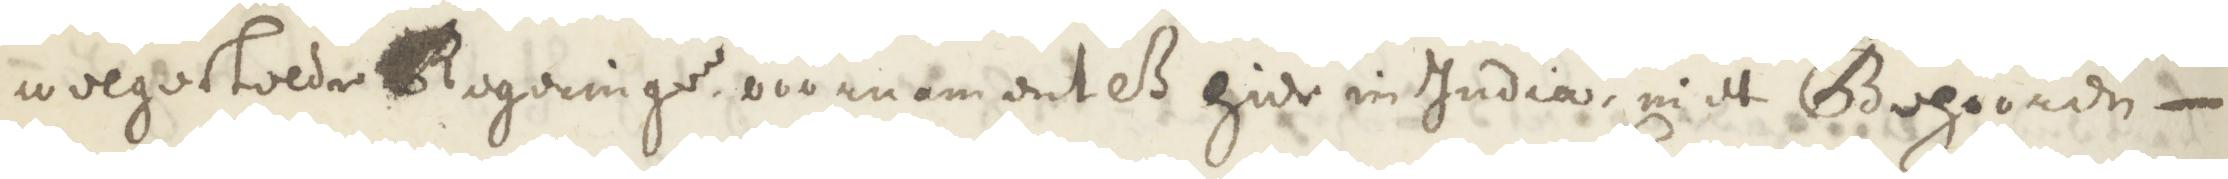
welgestelde Regeringe voornamentlijk hier in Jndia, niet Behooren —
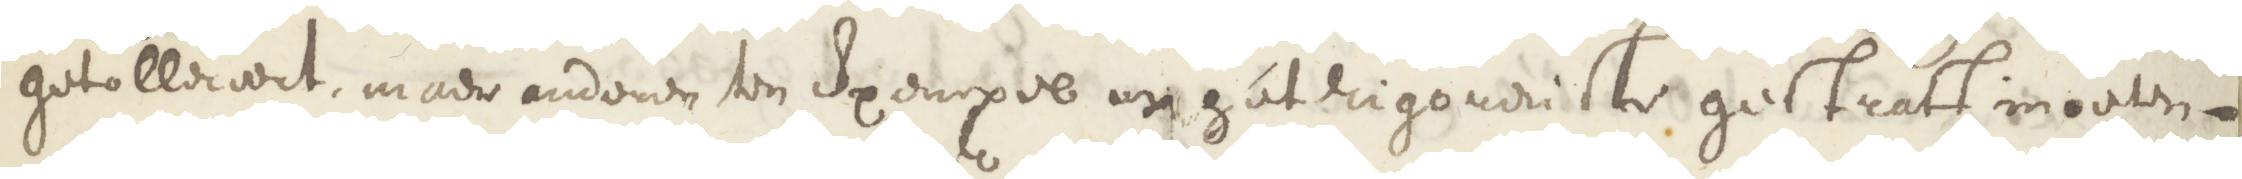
getollereert, maer anderen ten Exempel op het rigoreuste gestraft moeten —
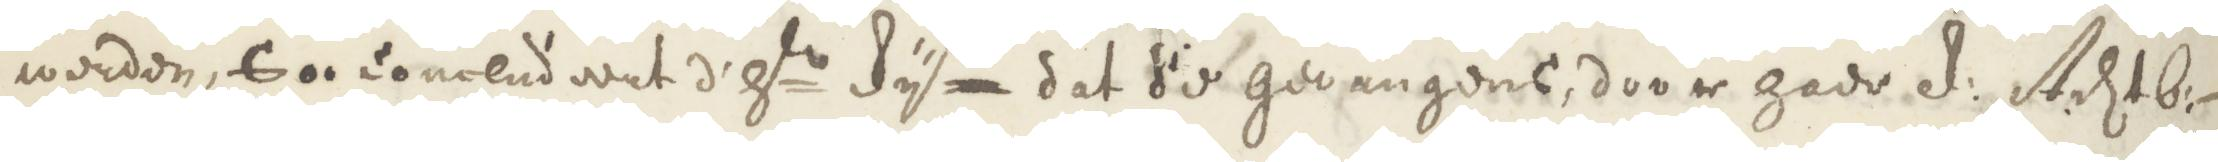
werden, Soo concludeert d' h=r Eij=r dat de gevangens, door haer E: Achtb:
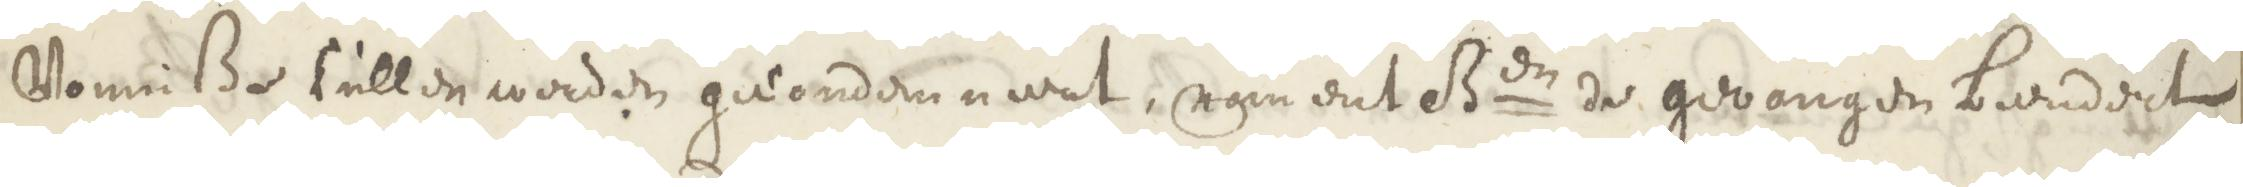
vonniꞵe sullen werden gecondemneert, namentlijk=en de gevangen Leendert
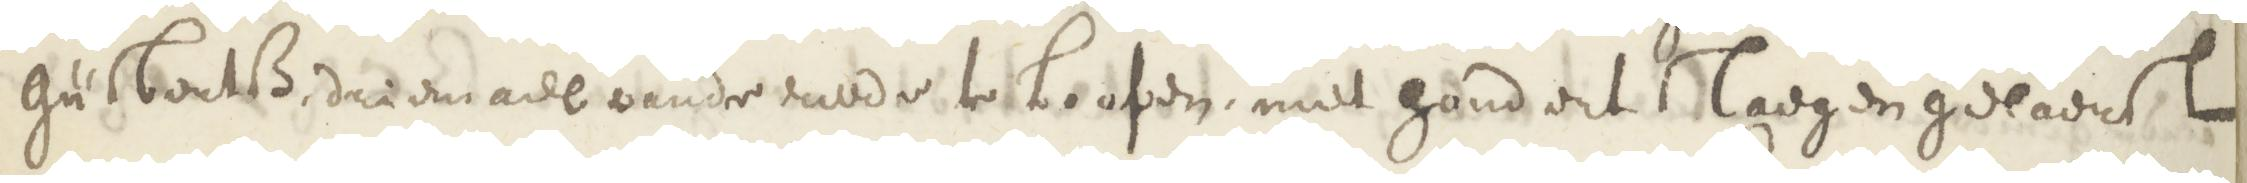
Gijsbertꞵ, driemael vande rede te loopen, met hondert slaegen gelaerst
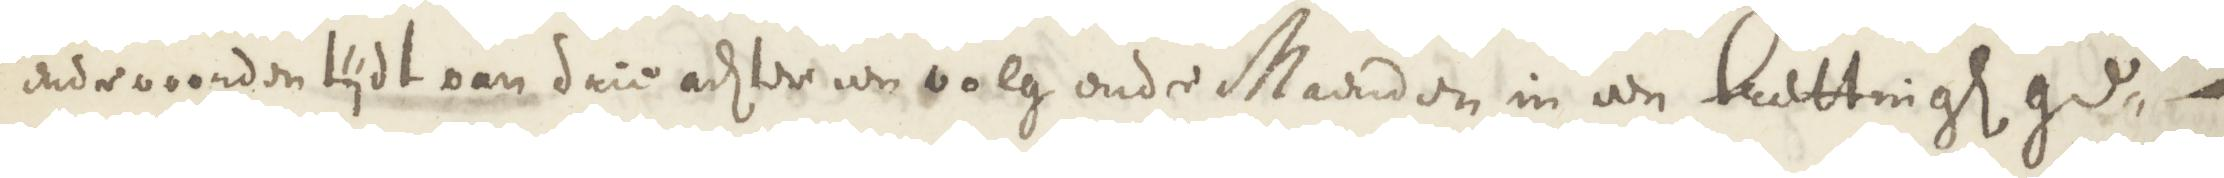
ende voorden tijdt van drie achter een volg ende Maenden in een kettingh ge„
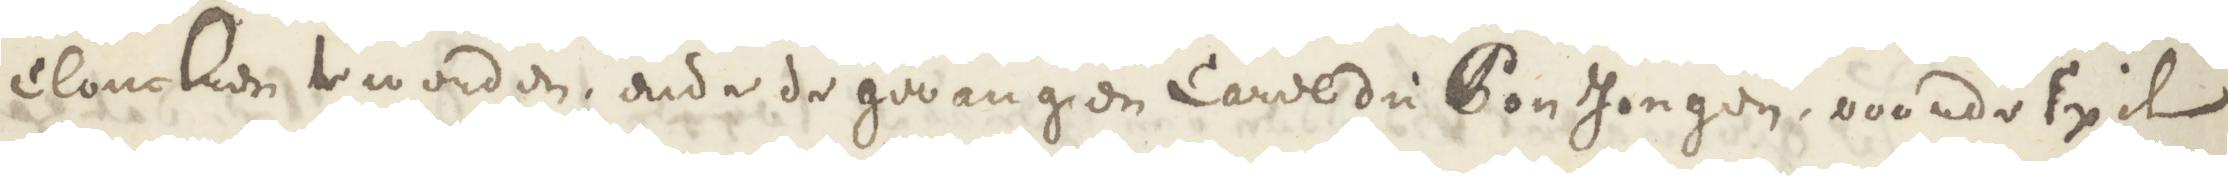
cloncken te werden, ende de gevangen Carel du Pon Jongen, voorde spil
